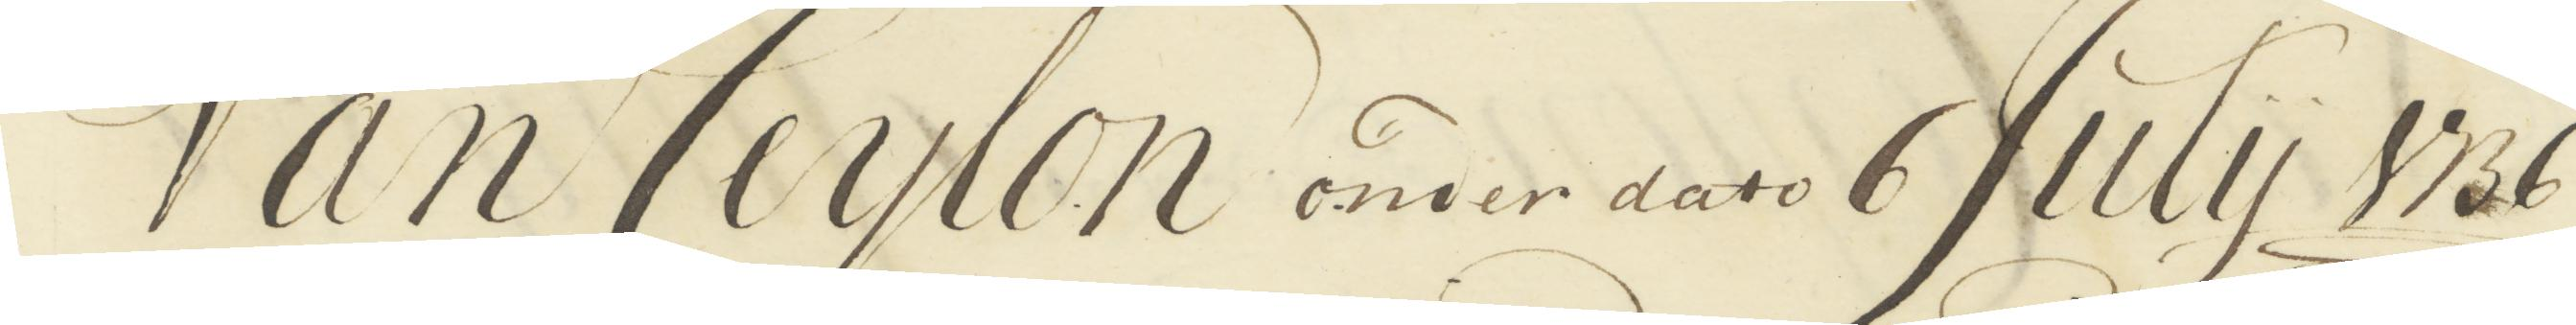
Van Ceylon oder dato 6 Julij 1736
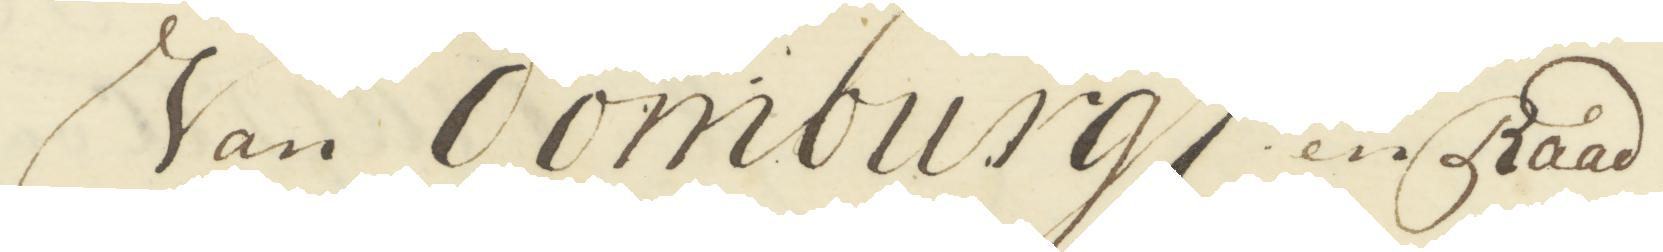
Van Domburgh en Raad
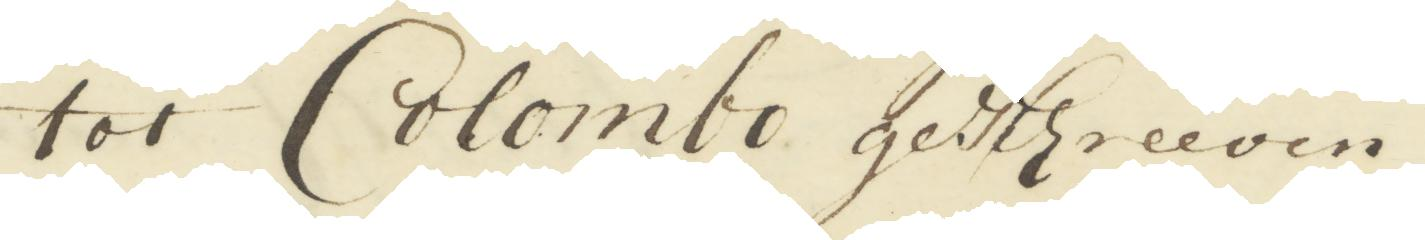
tot Colombo geschreeven
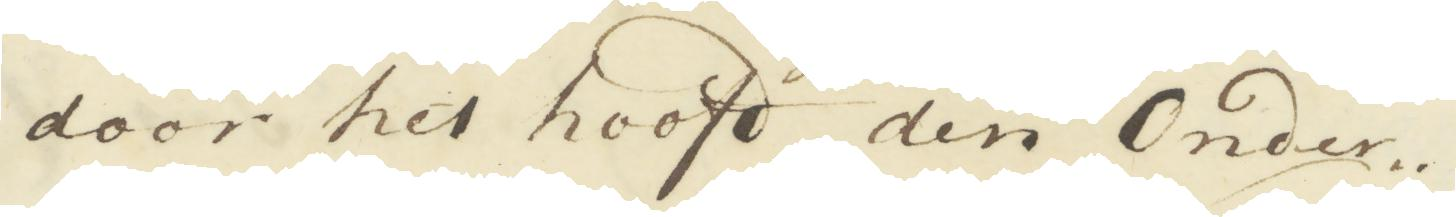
door het hoofd den Onder„
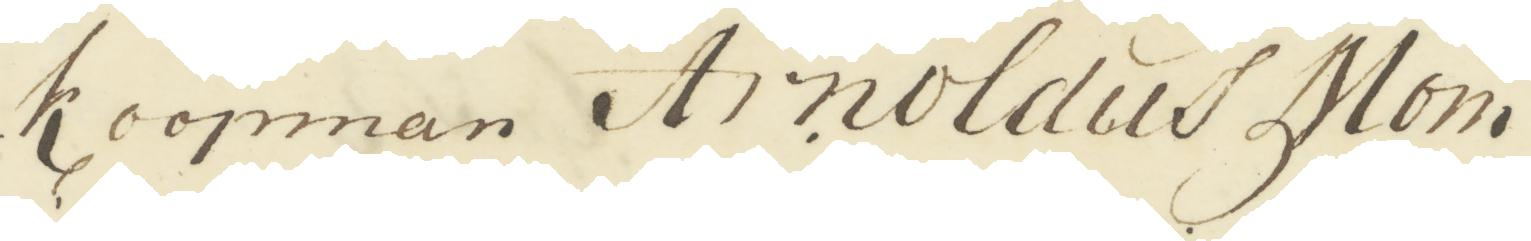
koopman Arnoldus Mom
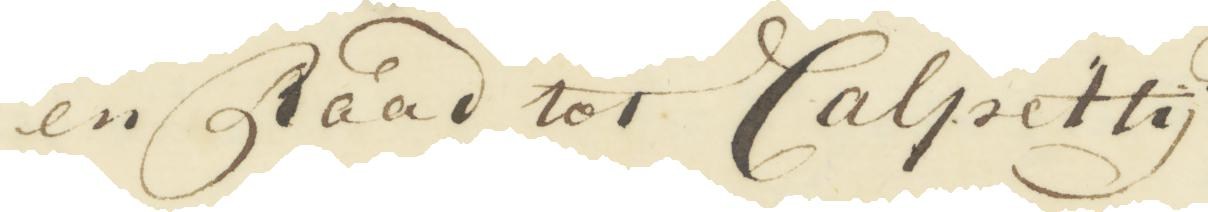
en Raad tot Calpettij
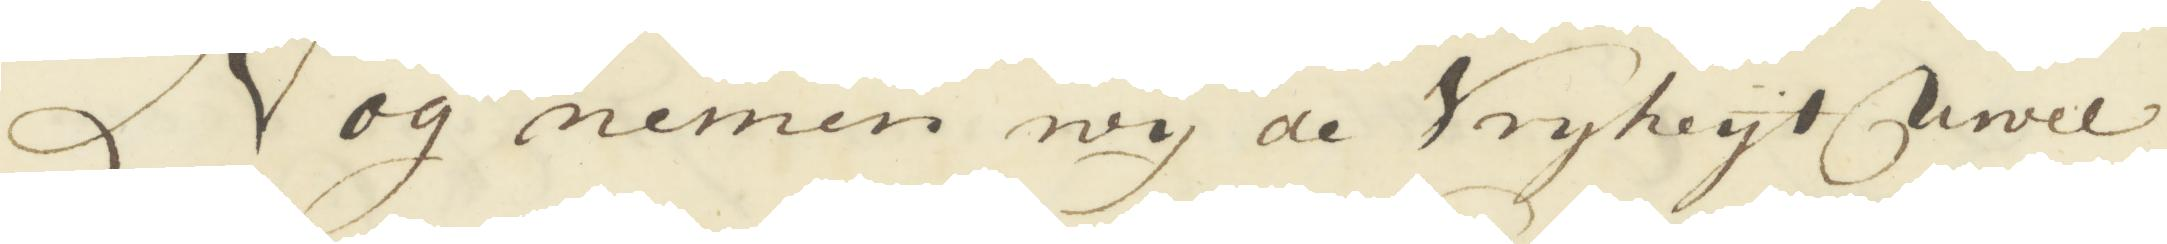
Nog nemen wy de Vryheijt uwel
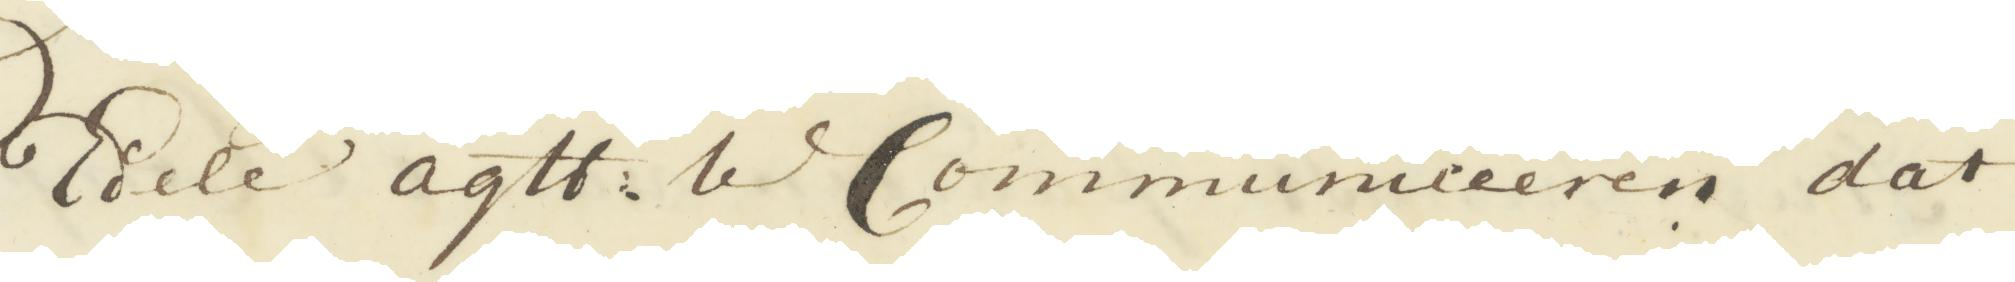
Edele agtb: te Communiceeren dat
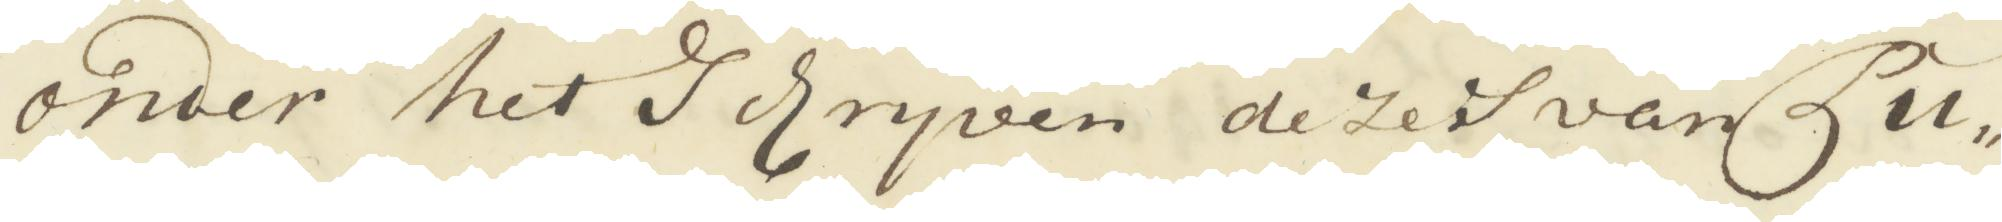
onder het schryven dezes van Pu„
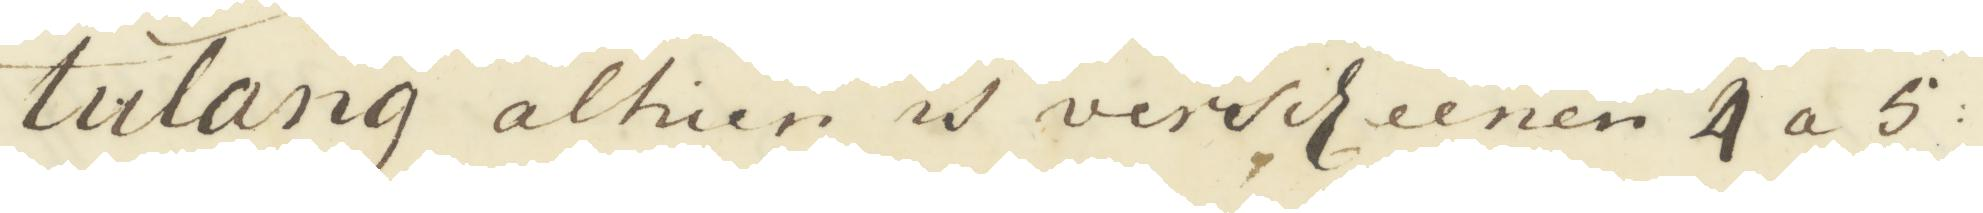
tulang alhier is verscheenen 4 a 5:
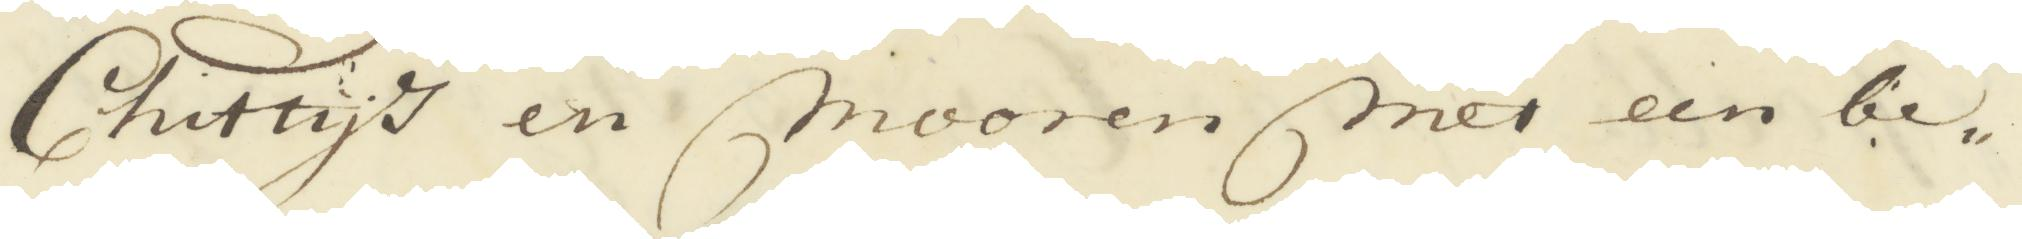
Chittijs en mooren met een be„
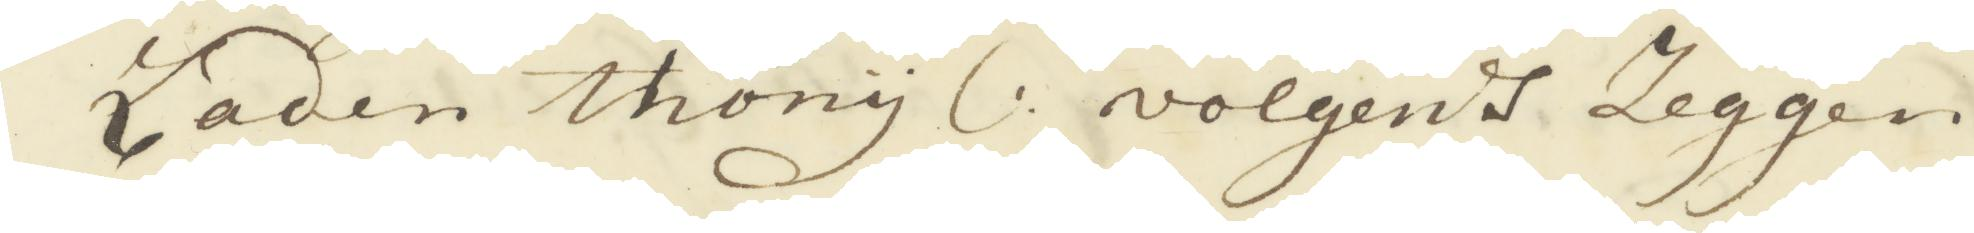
laden thonij (:volgens zeggen
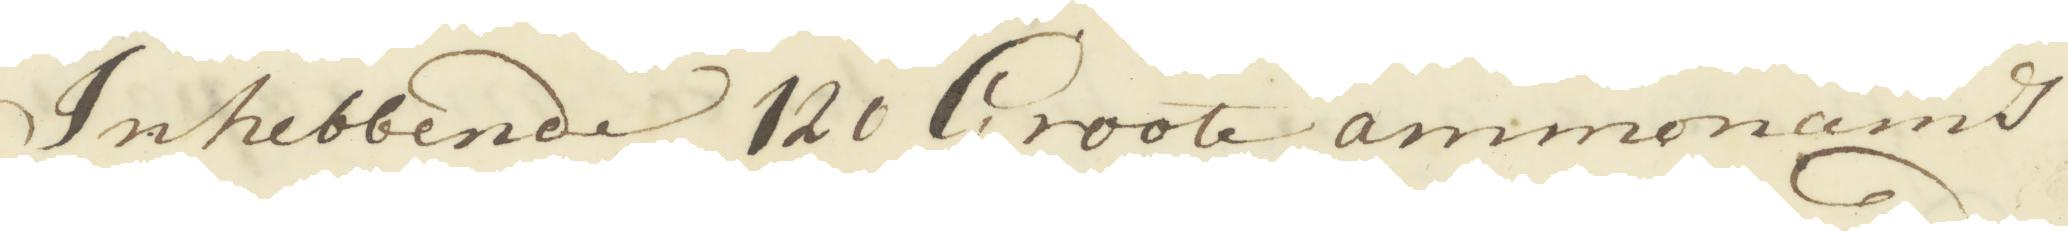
Inhebbende 120 Groote ammonams
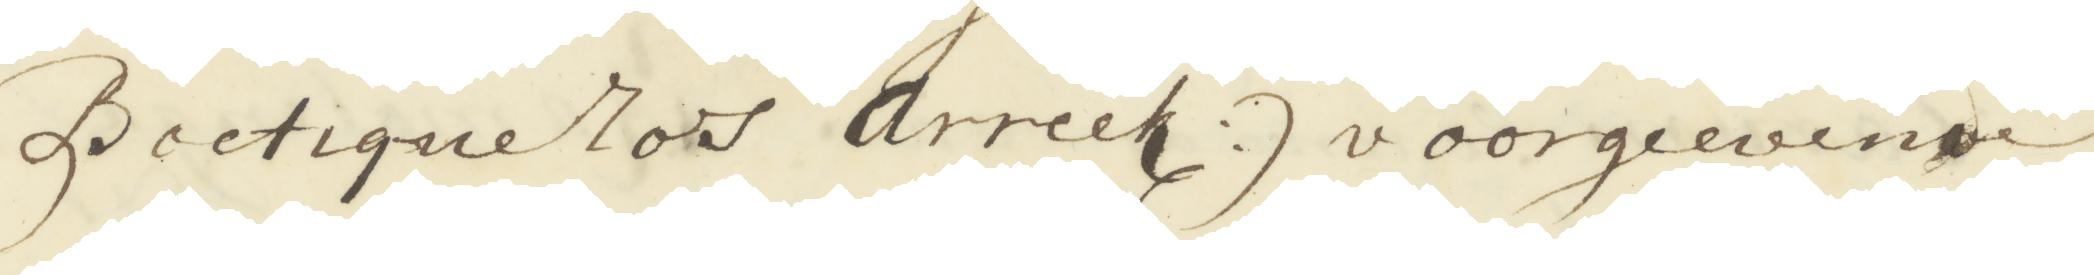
Boetiqueros Arreek:) voorgeevende
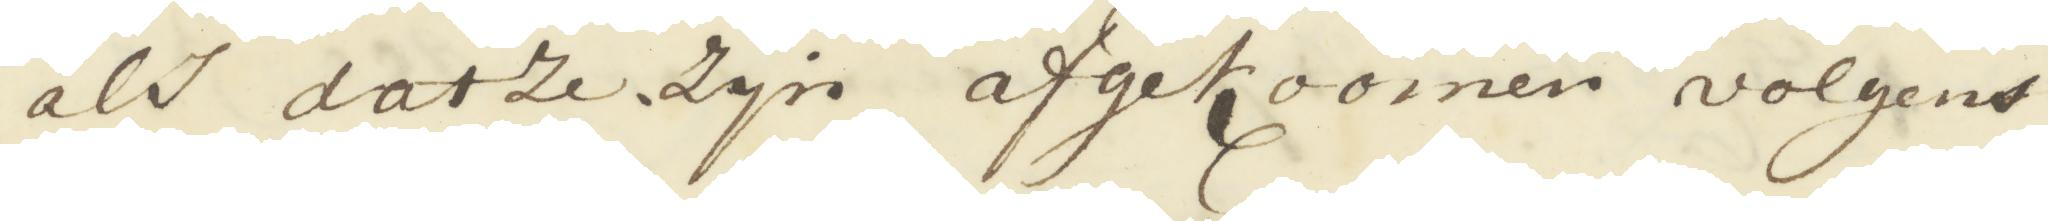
als datze zijn afgekoomen volgens
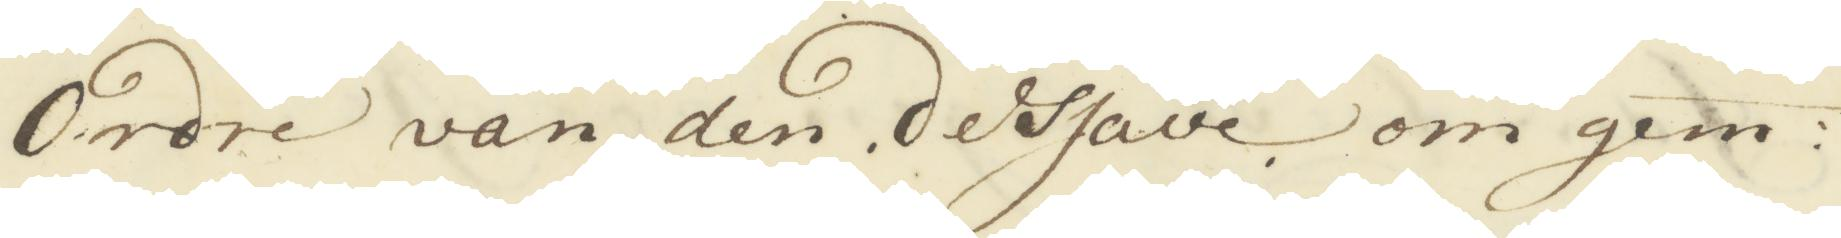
Ordre van den desjave om gem:
